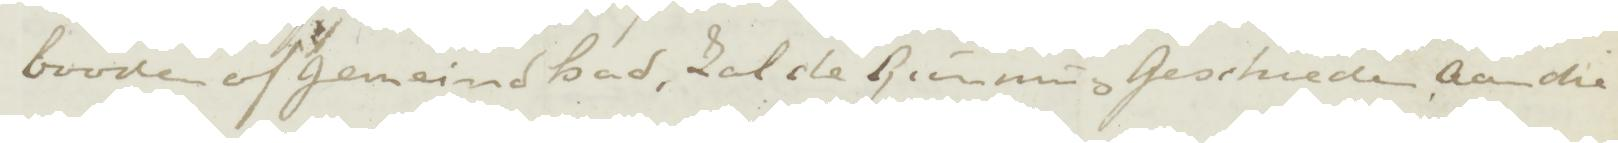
booden of gemeind had, Zal de Gunning geschieden aan die
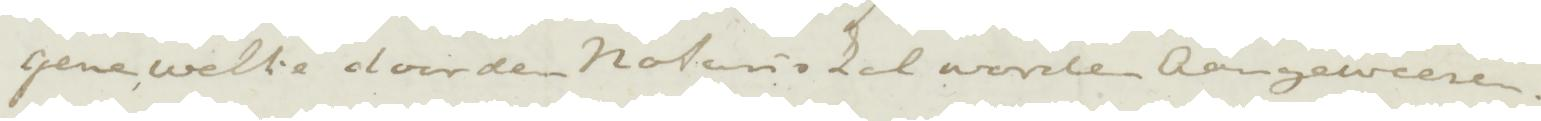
gene welke door den Notaris Zal worden Aangeweezen.
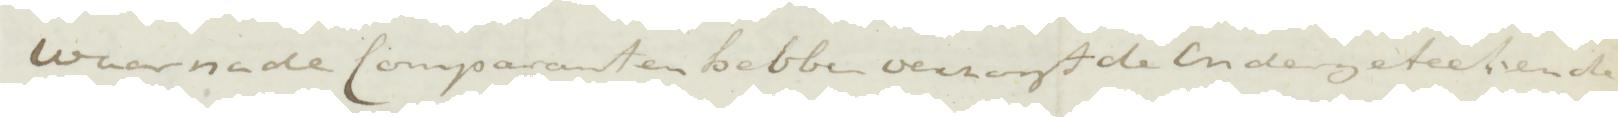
waarna de Comparanten hebben verzogt de ondergeteekende
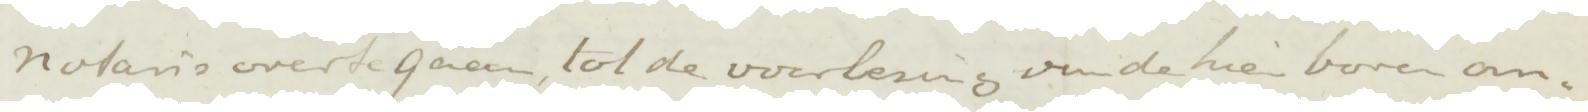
notaris over te gaan, tot de voorlezing van de hier boven om-
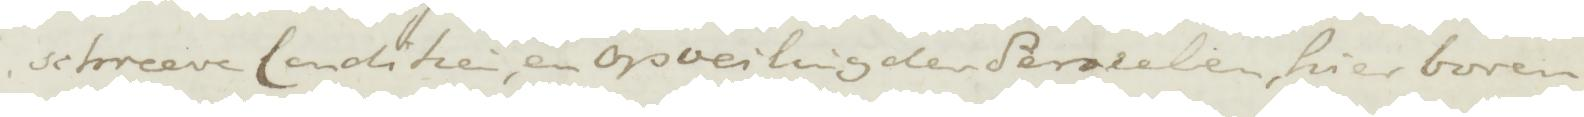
,schreeve Conditien, en opveiling der Perceelen, hier boven
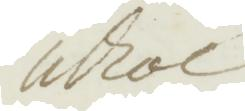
vthol
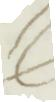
DC:
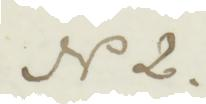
N 2.
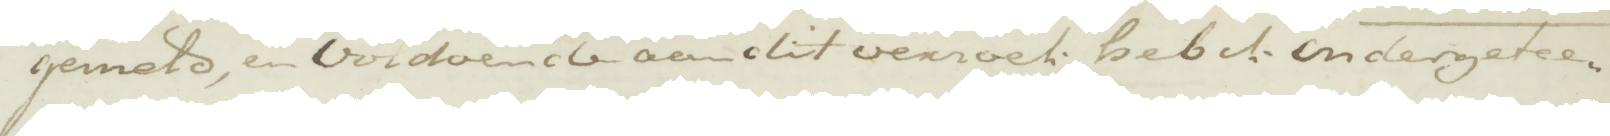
gemeld, en Voldoende aen dit verzoek heb ik ondergetee=
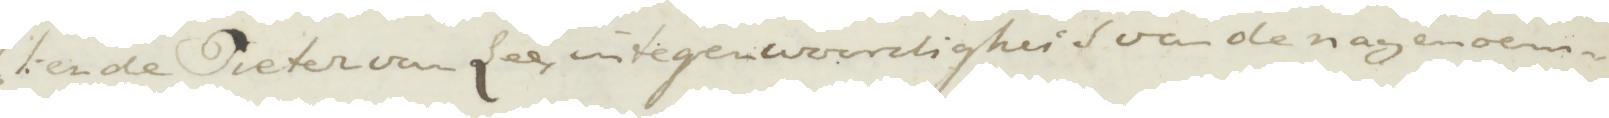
kende de Pieter van Lee in tegenwoordigheid van de nagenoem=
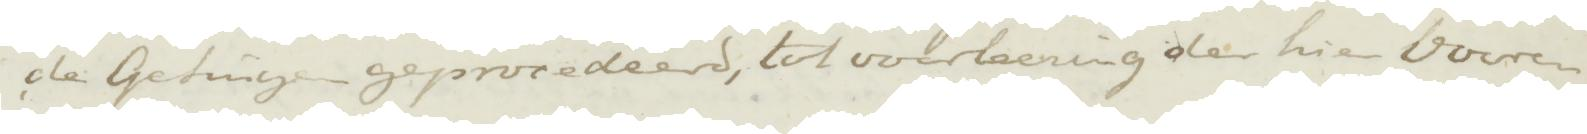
,de getuigen geprocedeerd, tot voorlezing de hier vooren
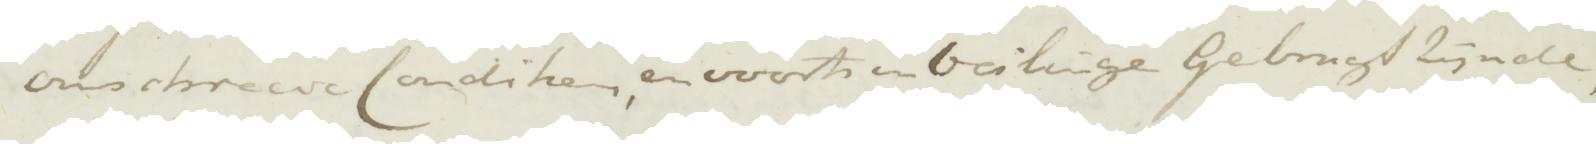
omschreeve Conditien en voorts in veilinge Gebragt Zijnde,
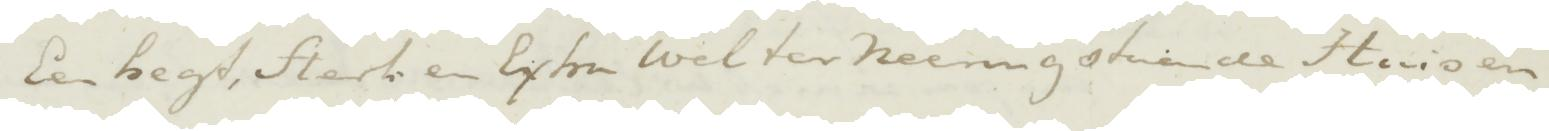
Een hegt, Sterk en Extra wel ter neering staande Huis en
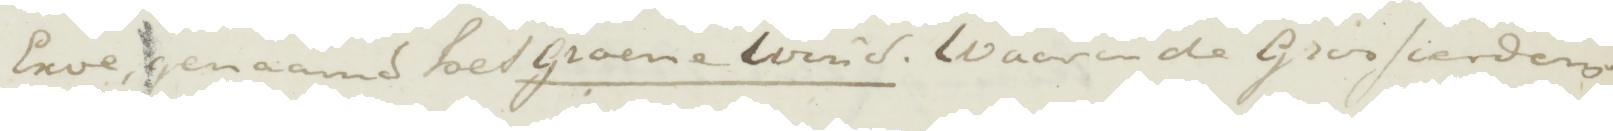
Erve, genaamd het Groene Woud, Waarin de Grossierden
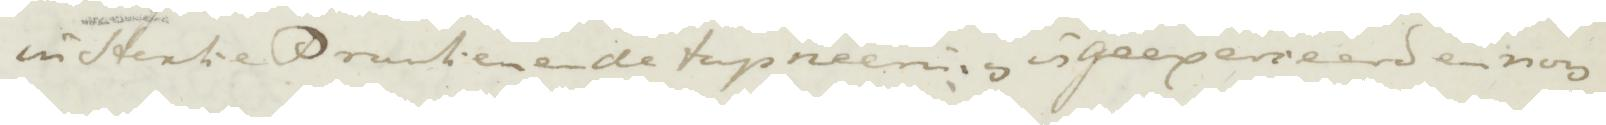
in Sterke Dranken en de tapneering, is geexerceerd en nog
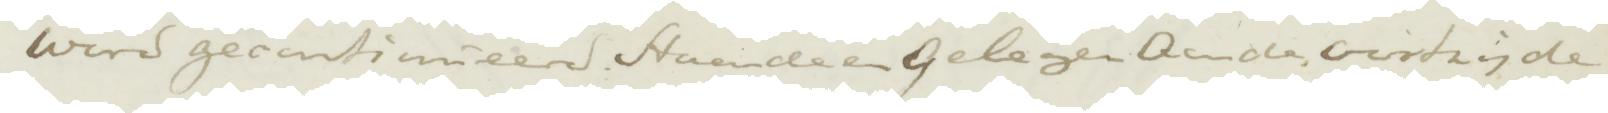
word gecontinueerd Staande en gelegen aan de oostzijde
